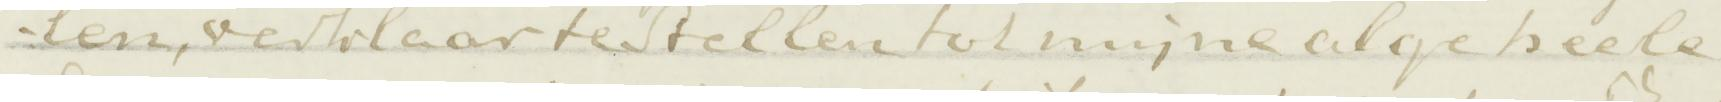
=len, verklaar te stellen tot mijne algeheele
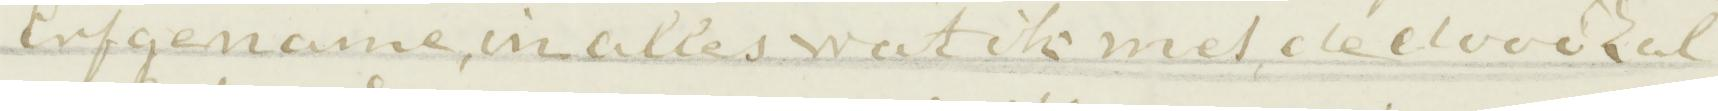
Erfgename, in alles wat ik met de dood zal
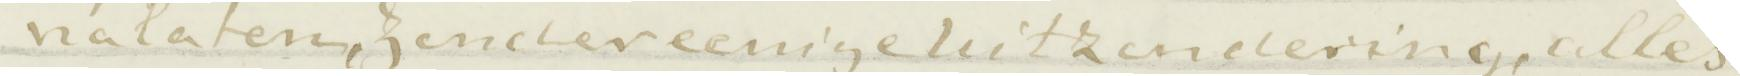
nalaten, zonder eenige uitzondering, alles
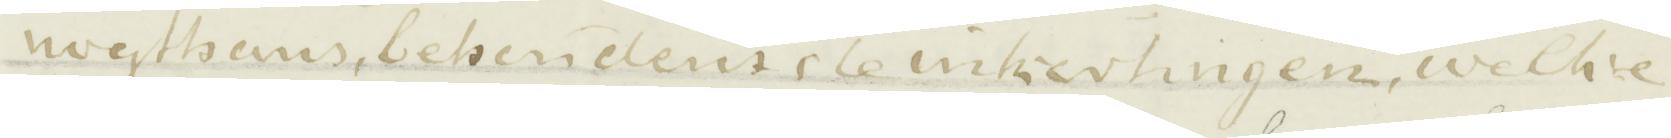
nogthans, behoudens de inkortingen, welke
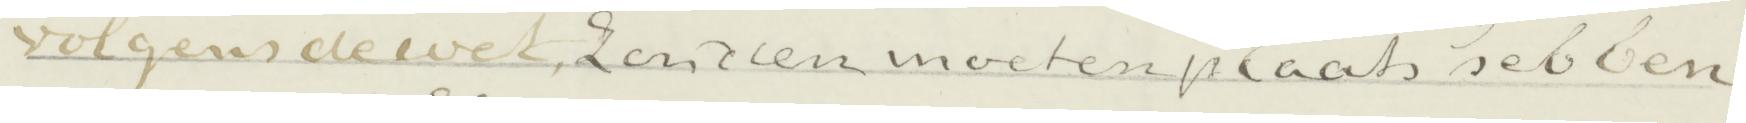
volgens de wet, zouden moeten plaats hebben
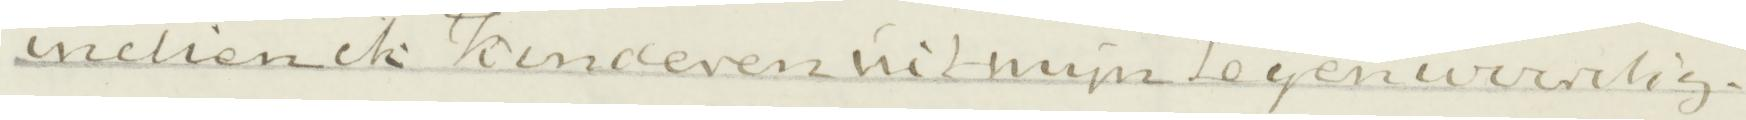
indien ik kinderen uit mijn tegenwoordig-
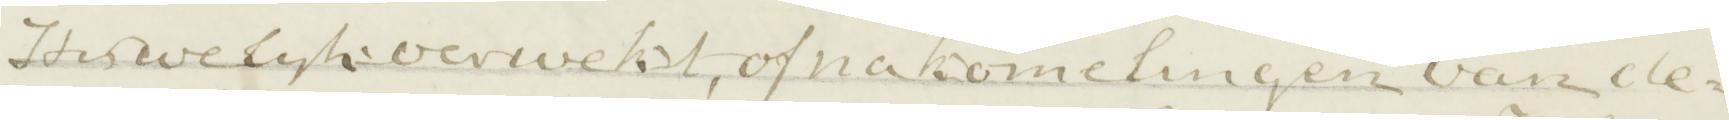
Huwelyk verwekt, of nakomelingen van de=
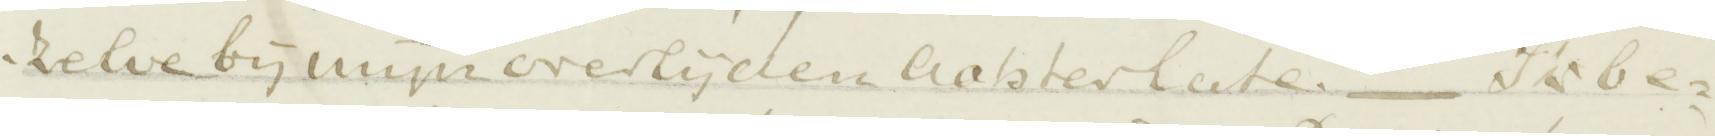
-zelve bij mijn overlijden achterlate. — Ik be=
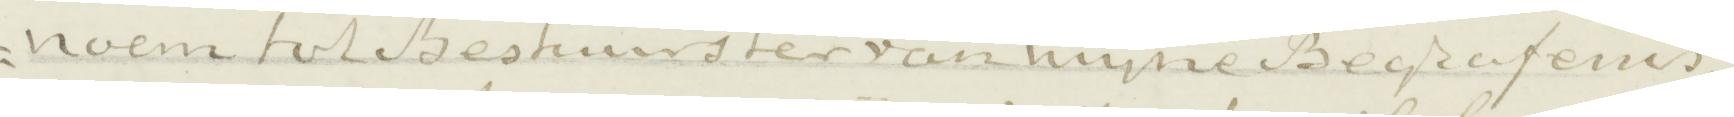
noem tot Bestuurster van mijne Begrafenis,
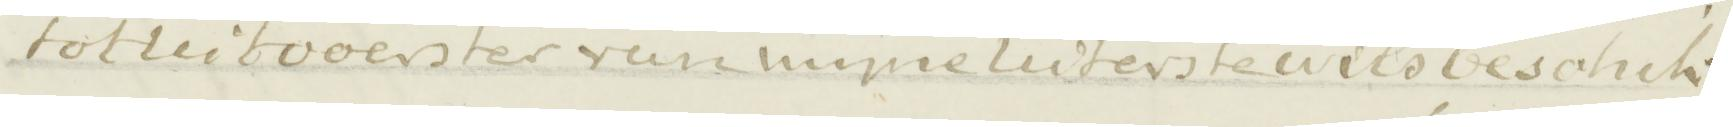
tot uitvoerster van mijne uiterste wilsbeschik
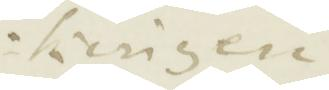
=kingen
